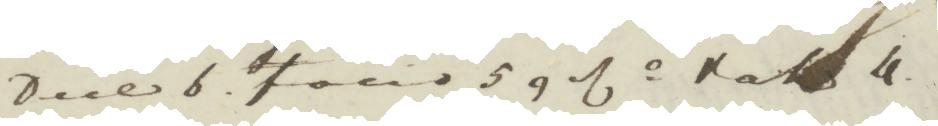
deel 6. folio 5 9 V=o vak 4.
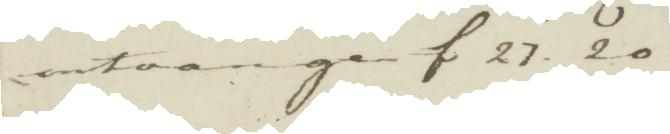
ontvangen ƒ 27. 20
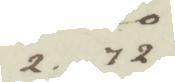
2. 72
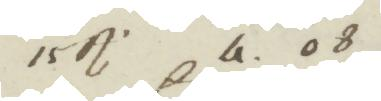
15 P/' 4. 08
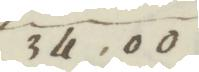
34 ,00
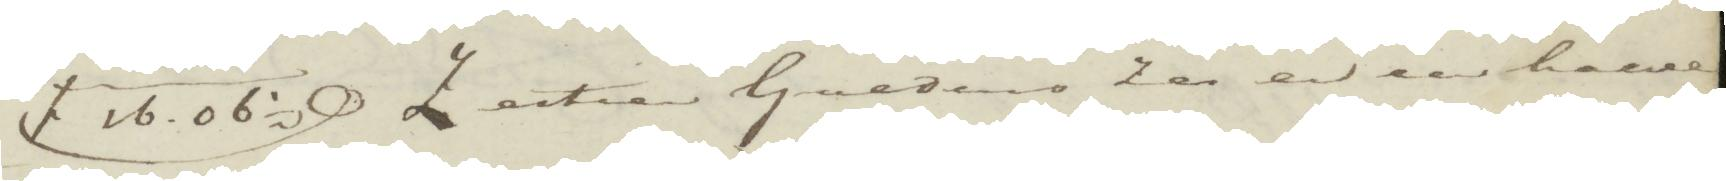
ƒ 16. 06½ Zestien Guldens zes en een halve
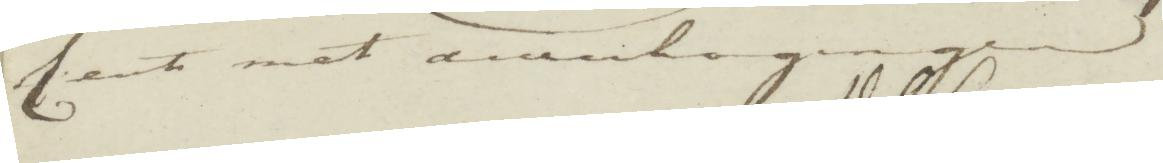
Cent met deverhogingen
